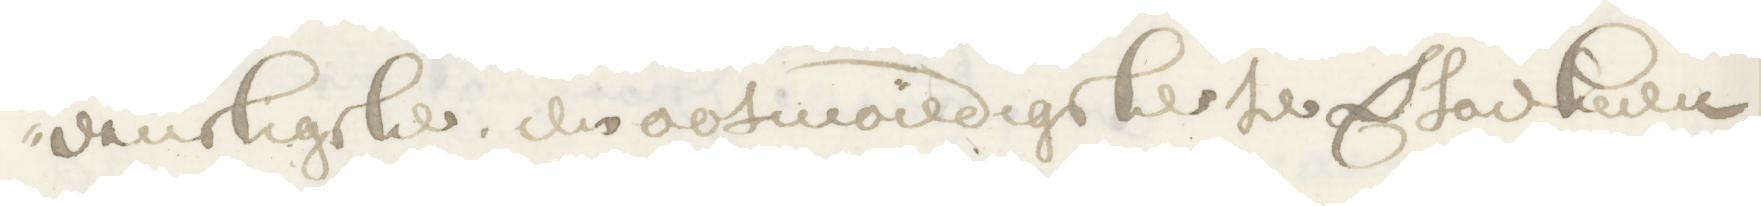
„ernsligske, en ootmoedwiediglese te versoeken
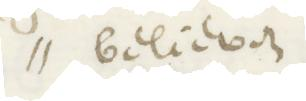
„ believen
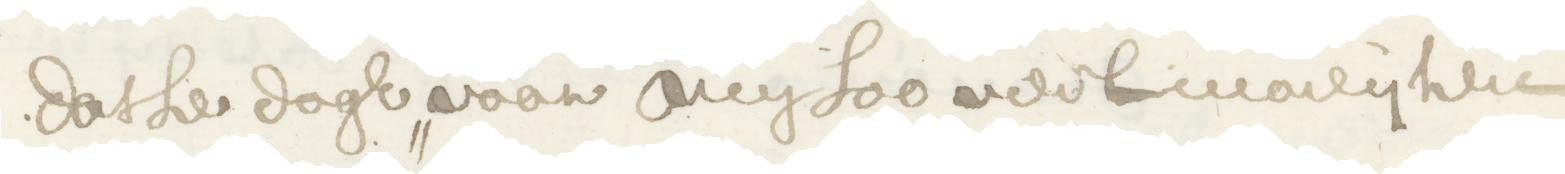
datse dogh „voor wij soo veel moelijken
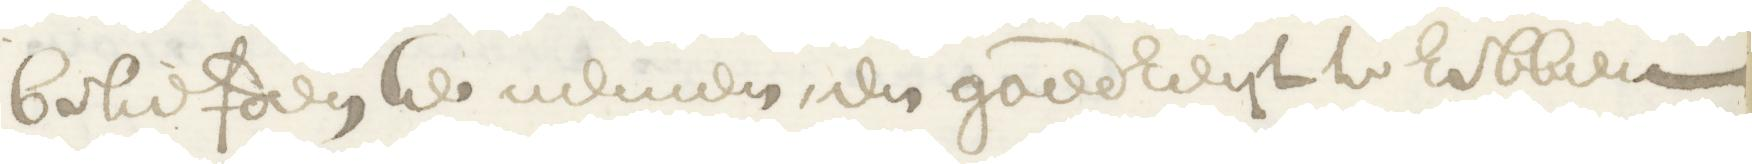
beliefden te nemen, en goedheijt te hebben
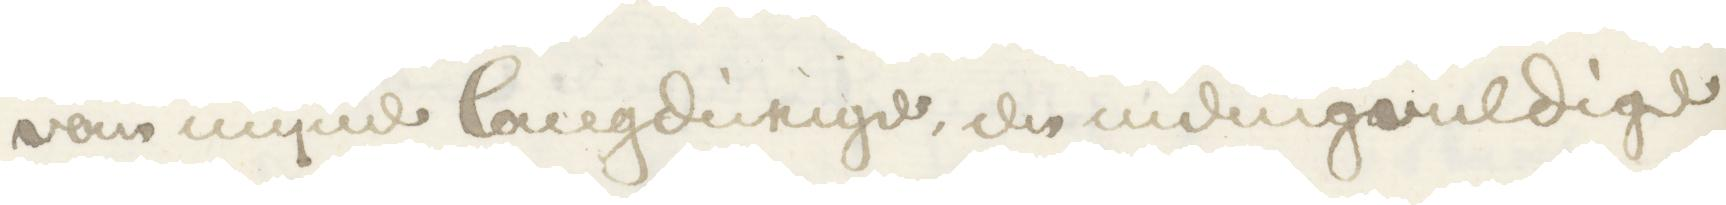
van mijne langdurige, en menigvuldige
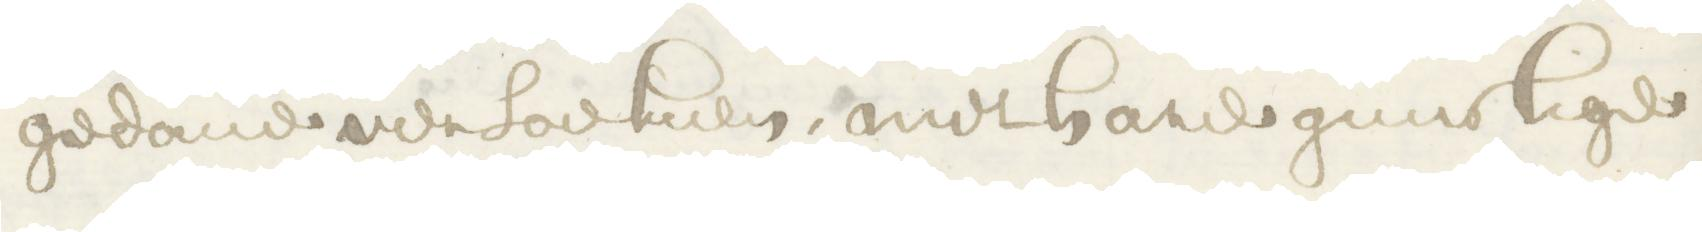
gedane versoeken, met hare gunstige
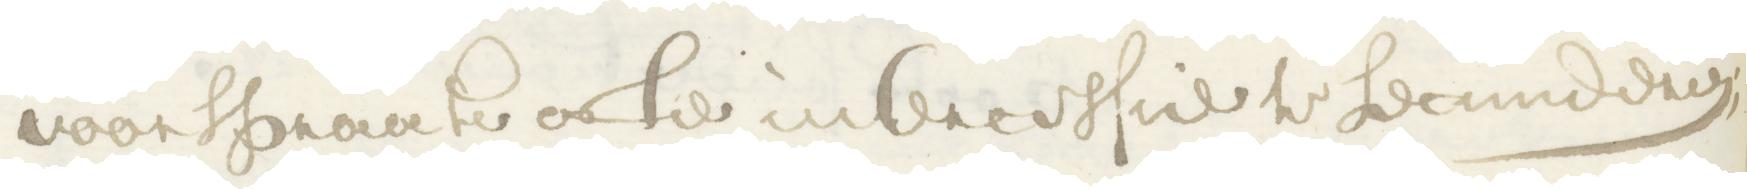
voor spraak oste intercessie te secunderen,
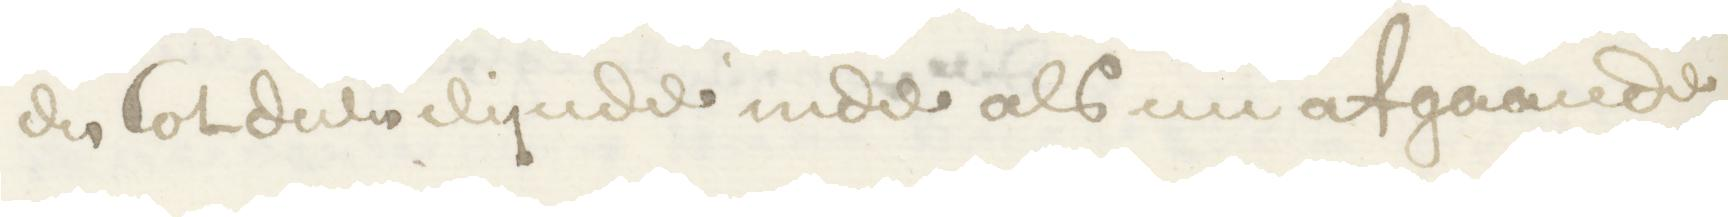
en tot dien eijnde inde als nu afgaande
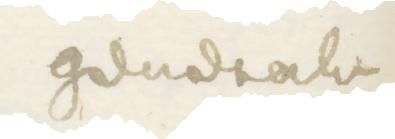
generale
